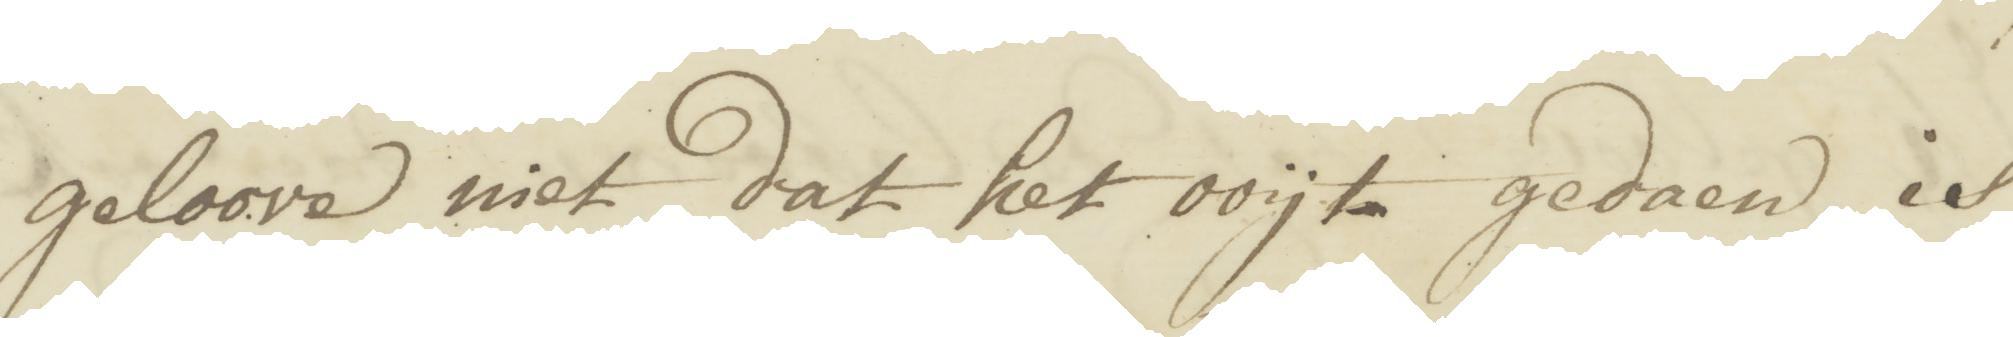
geloove niet dat het ooijt gedaen is
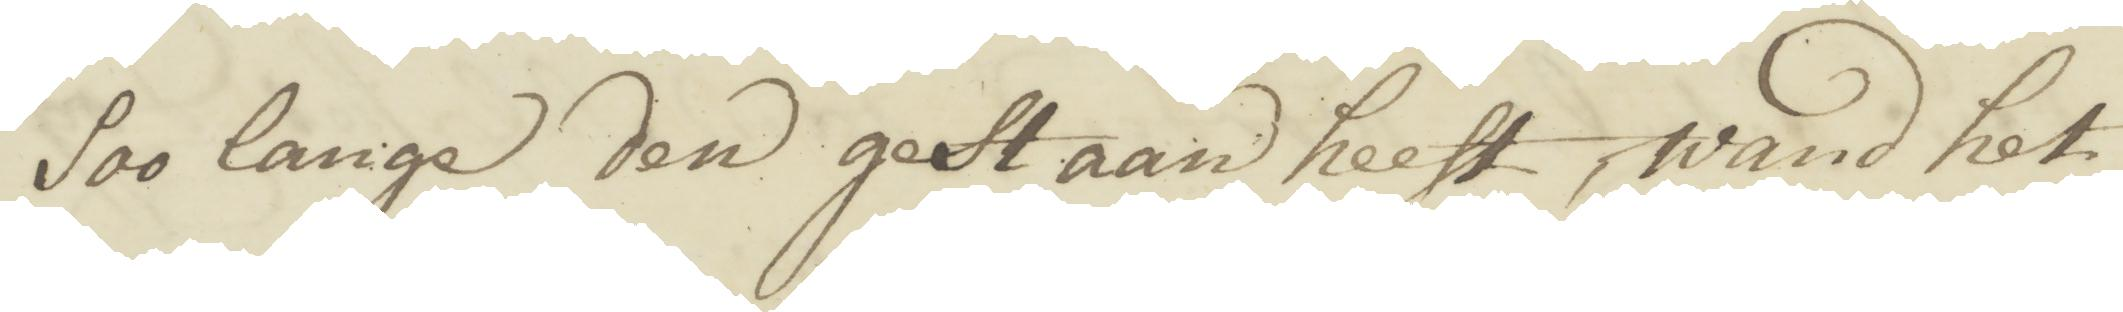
soo lange den gestaan heeft, wand het
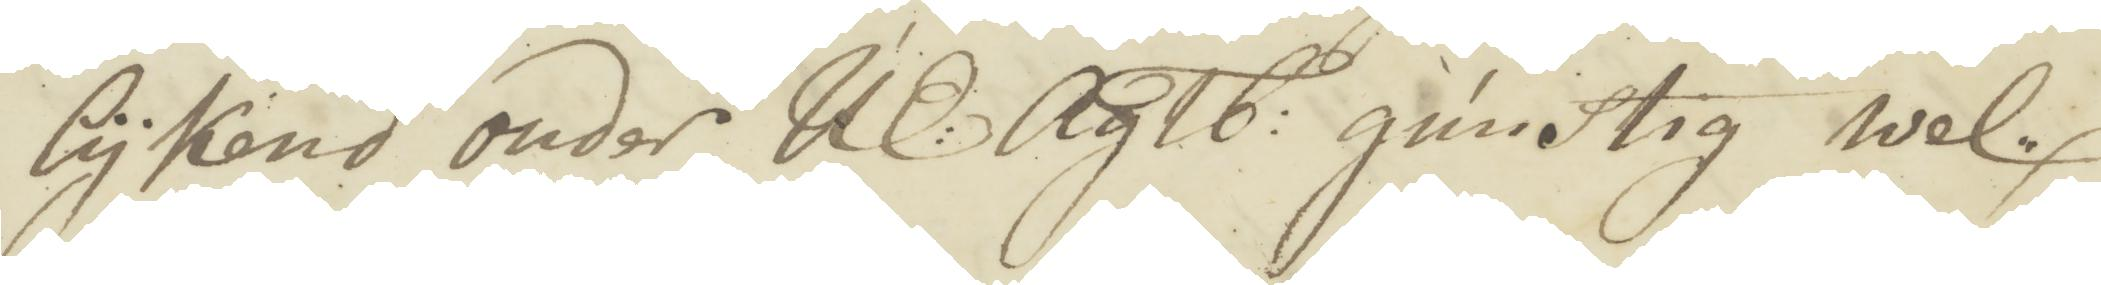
lijkend ouder UE: Agtb: gunstig wel„
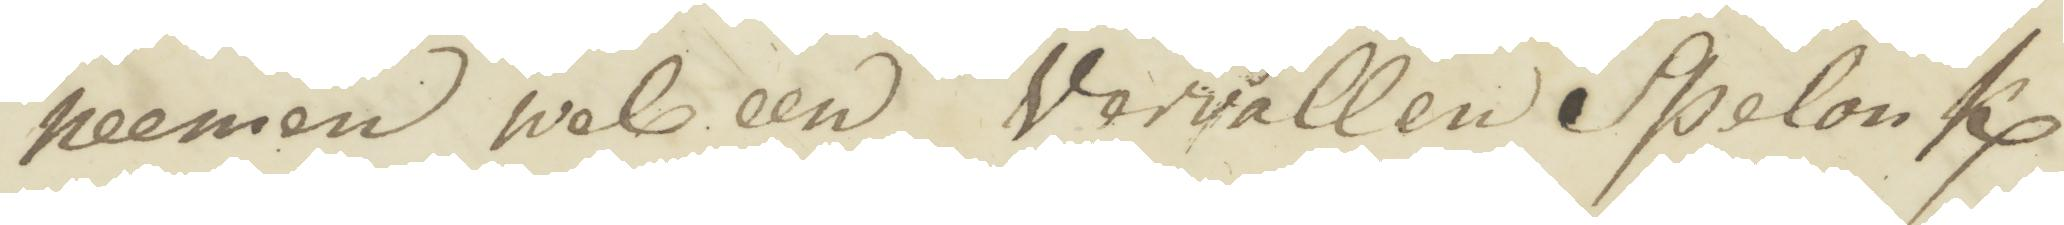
neemen wel een vervallen spelonk
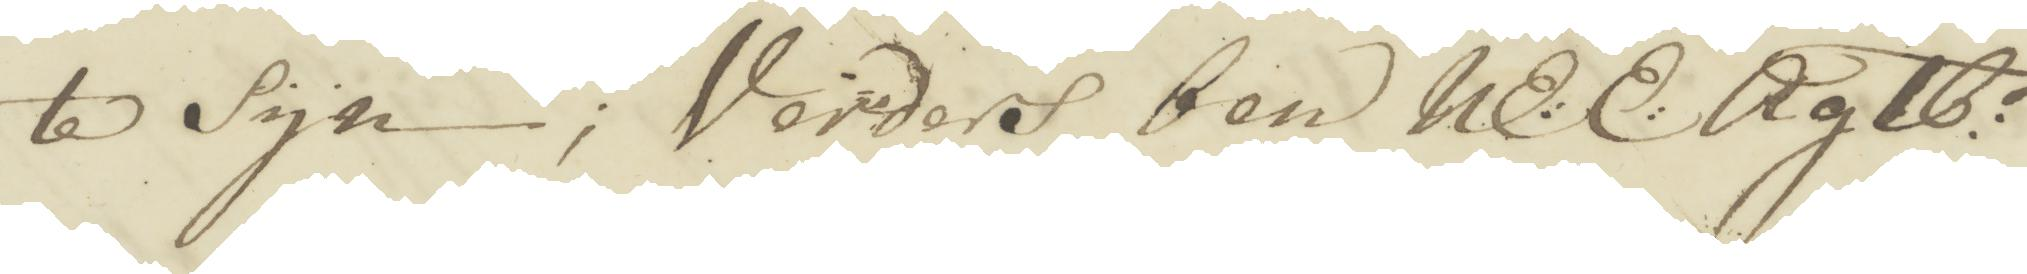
te sijn; Vorders ben UE:E: Agtb:r
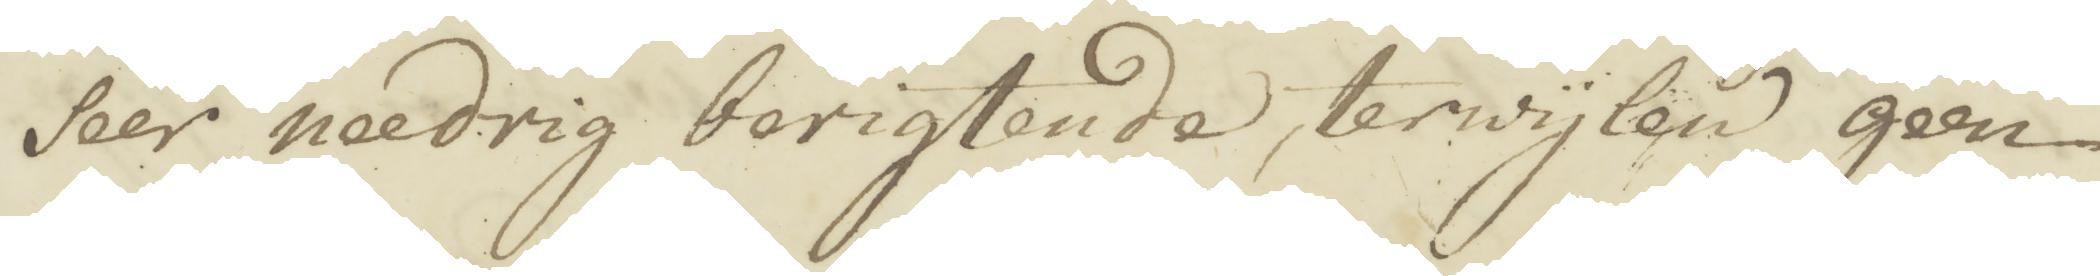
seer needrig berigtende, terwijlen geen
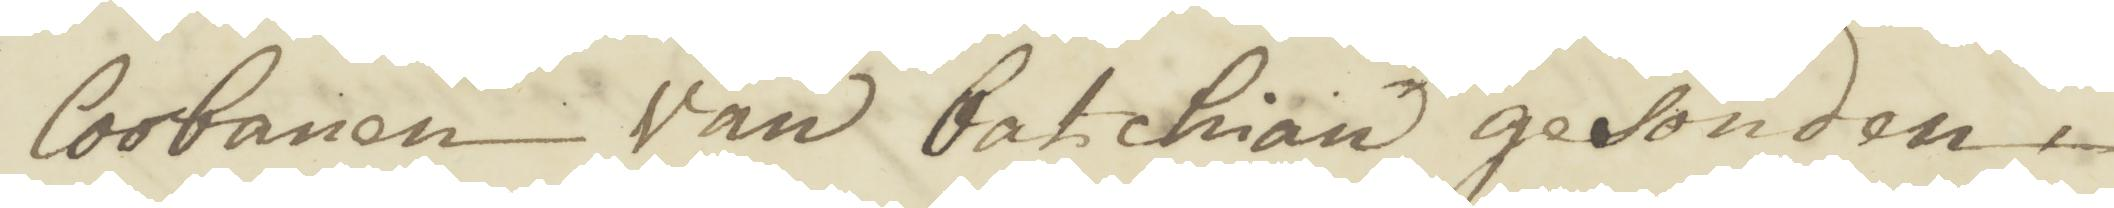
Coobanen van batchian gesonden,
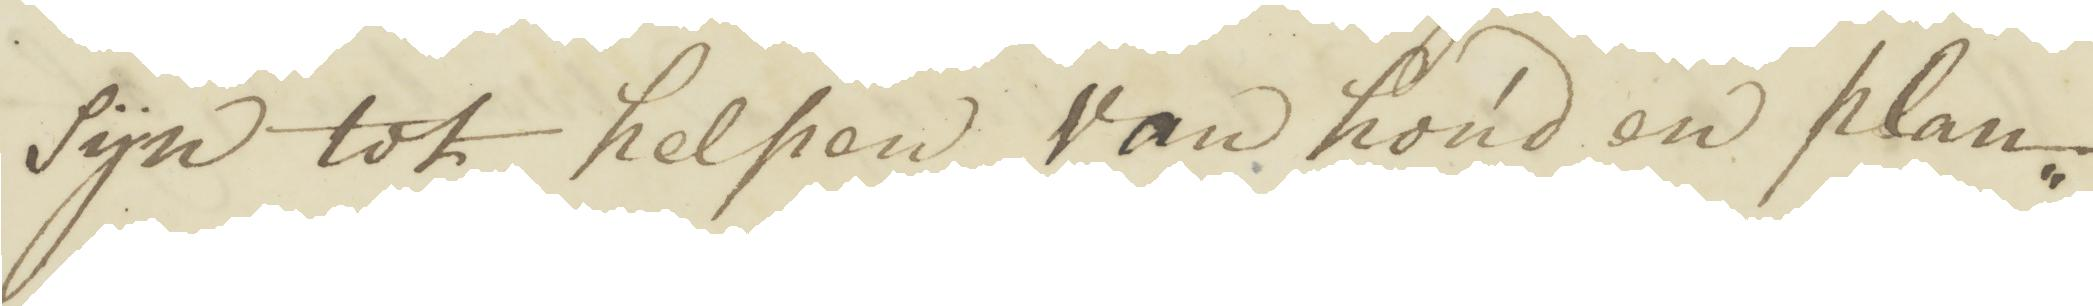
sijn tot helpen van houd en plan„
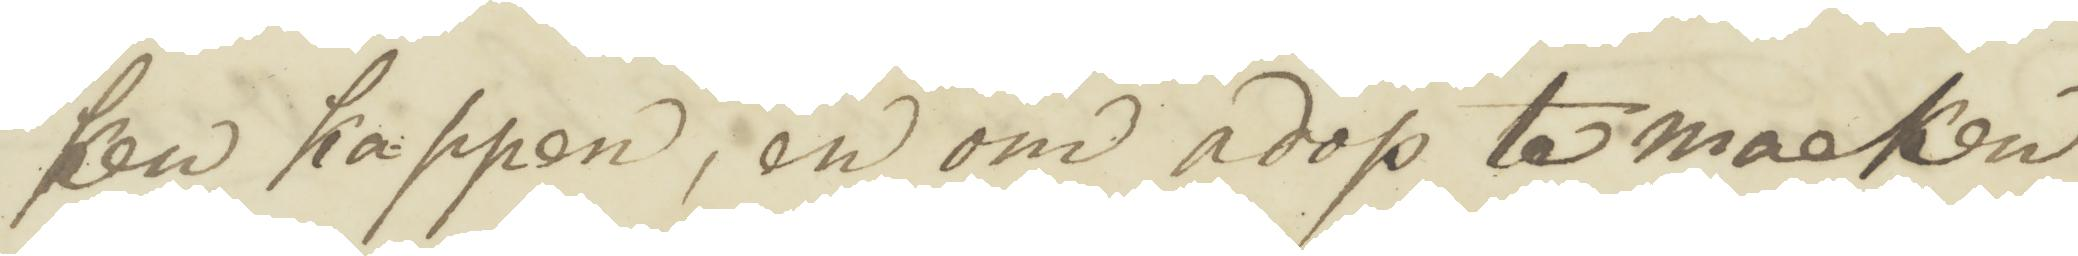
ken kappen, en om adop te maeken
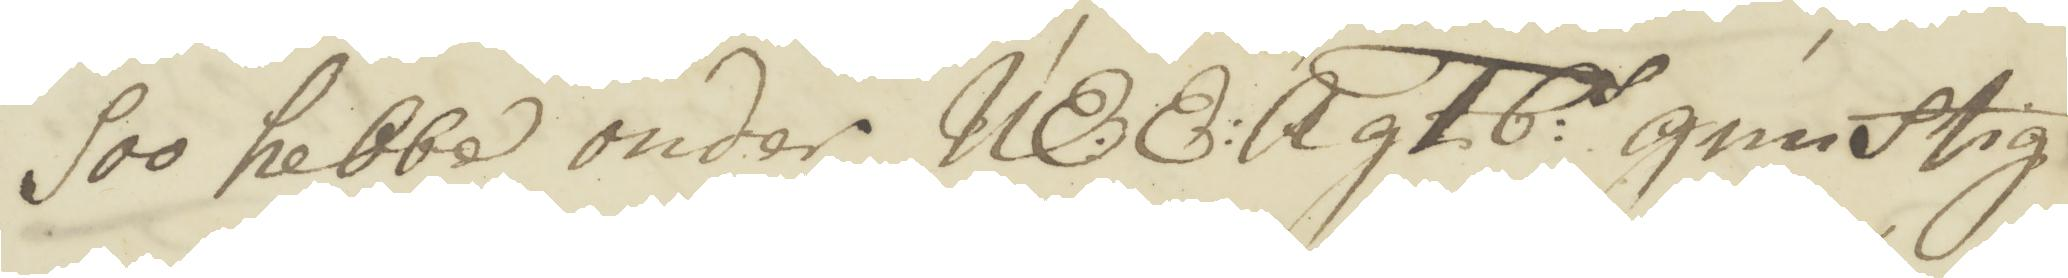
soo hebbe onder UE:E: Agtb:s gunstig
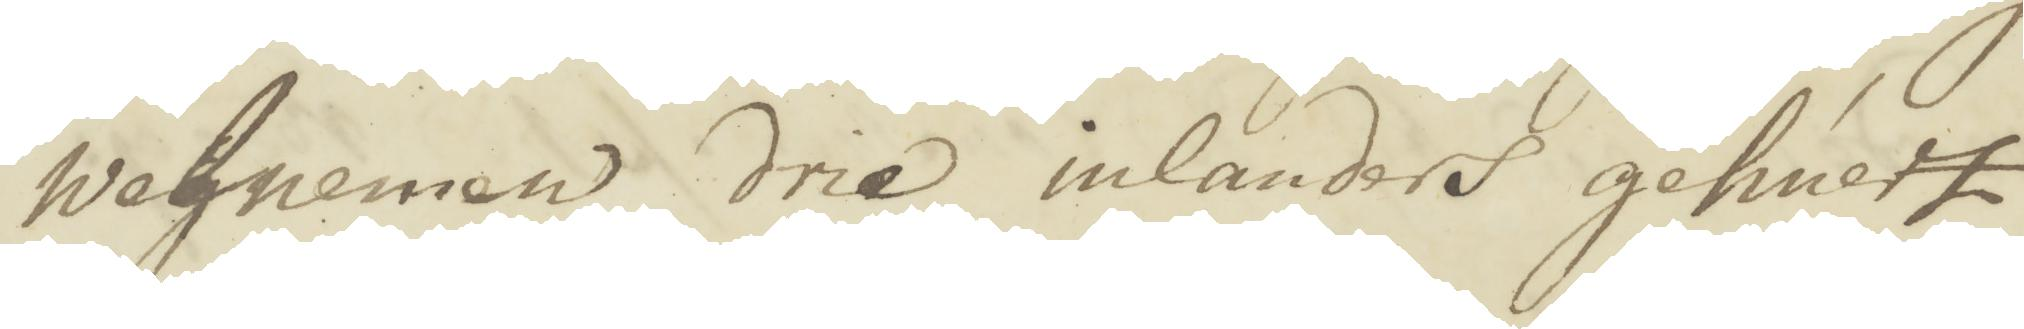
welnemen drie inlanders gehuert
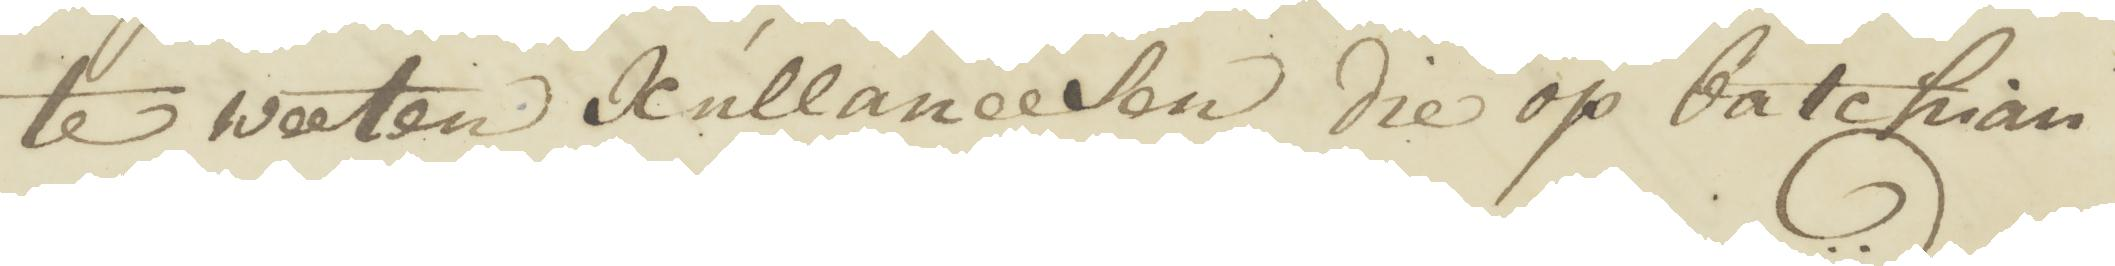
te weeten kullaneesen die op batchian
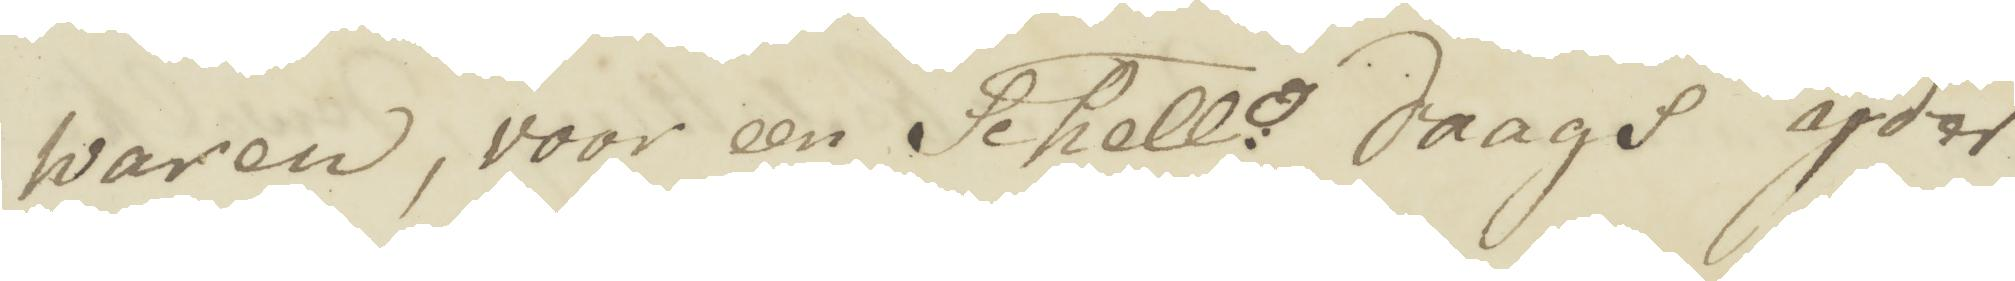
waren, voor een schell:s daags ijder
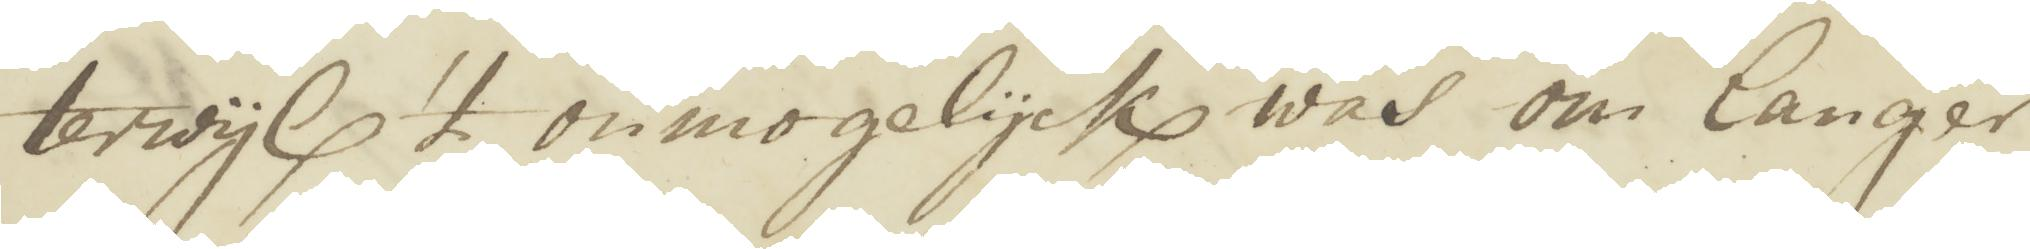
terwijl ’t onmogelijck was om langer
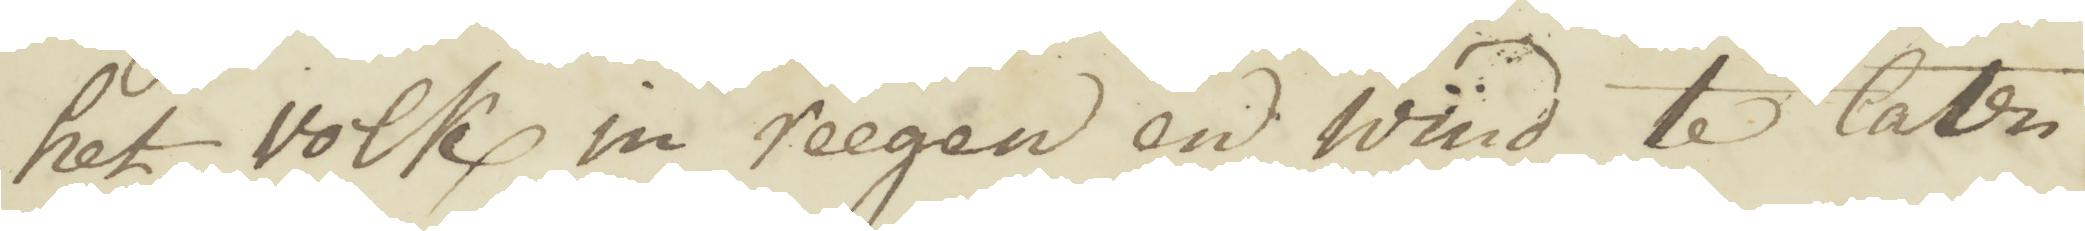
het volk in reegen en wind te laten
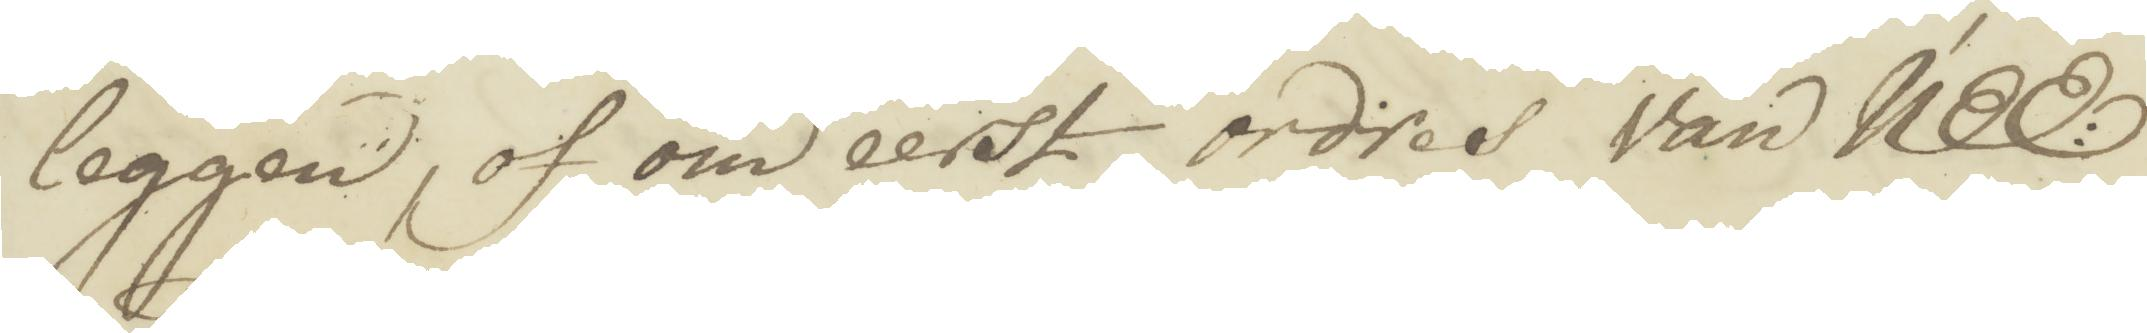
leggen, of om eerst ordres van UEE:
